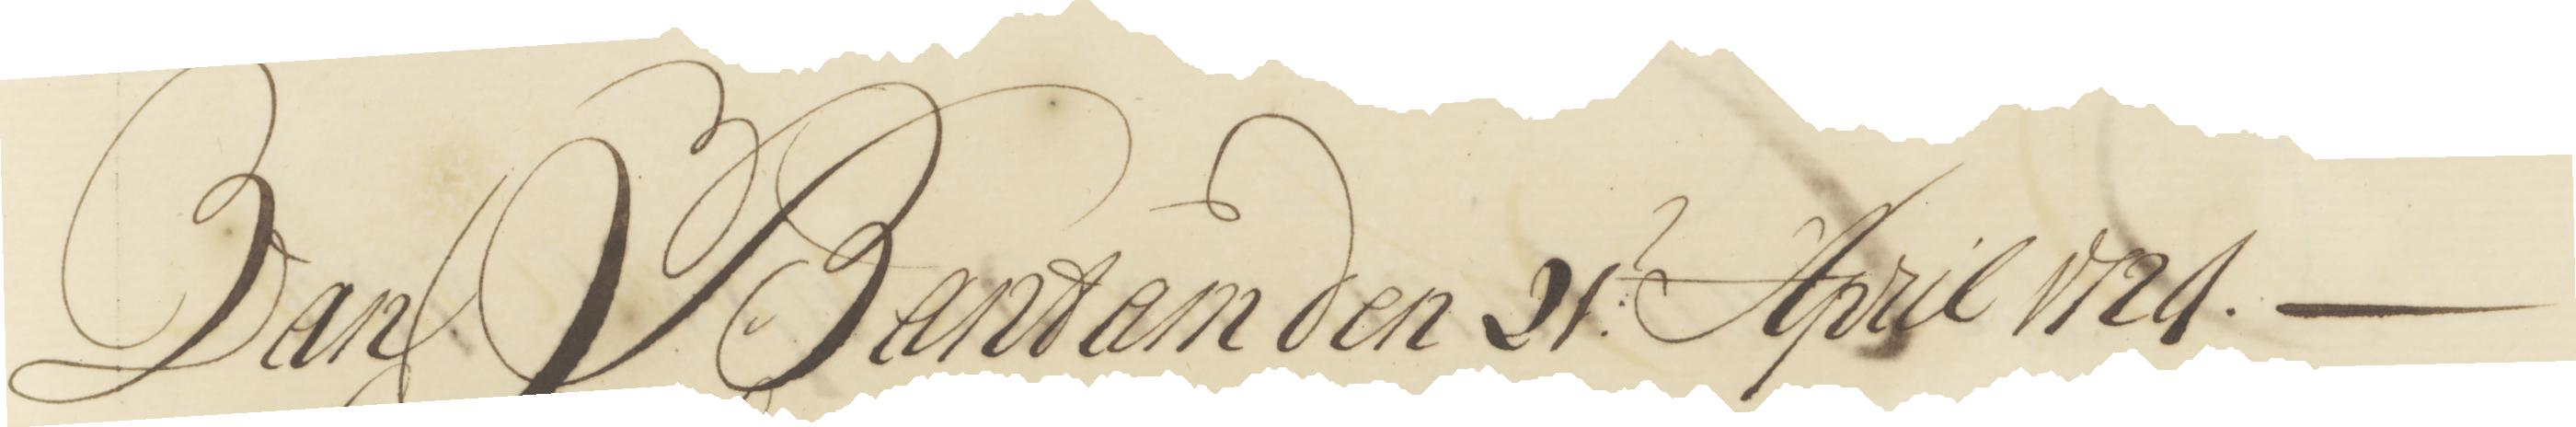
Van Bantam den 21:' April 1724. —
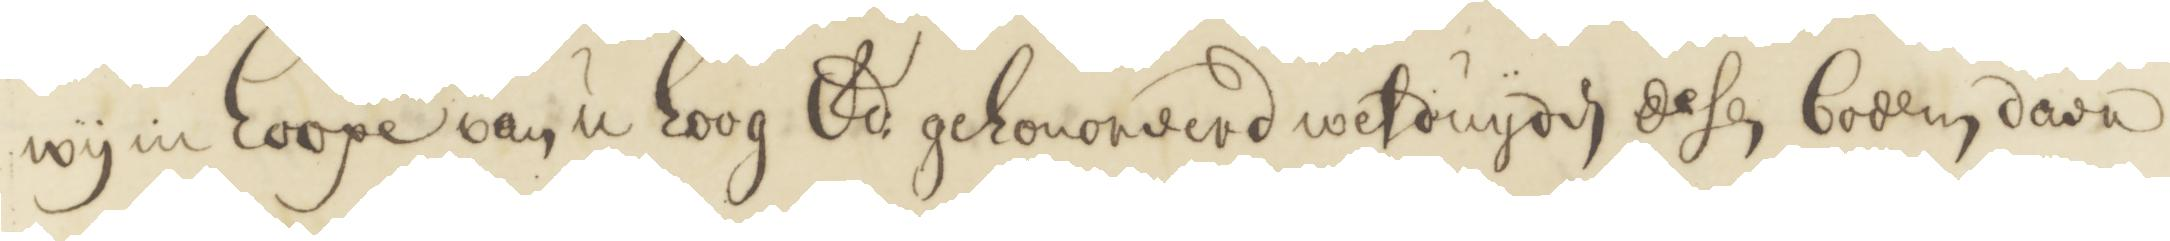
wij in hoope van u hoog Ed: gehonoreerd welduijden desen bodem daer
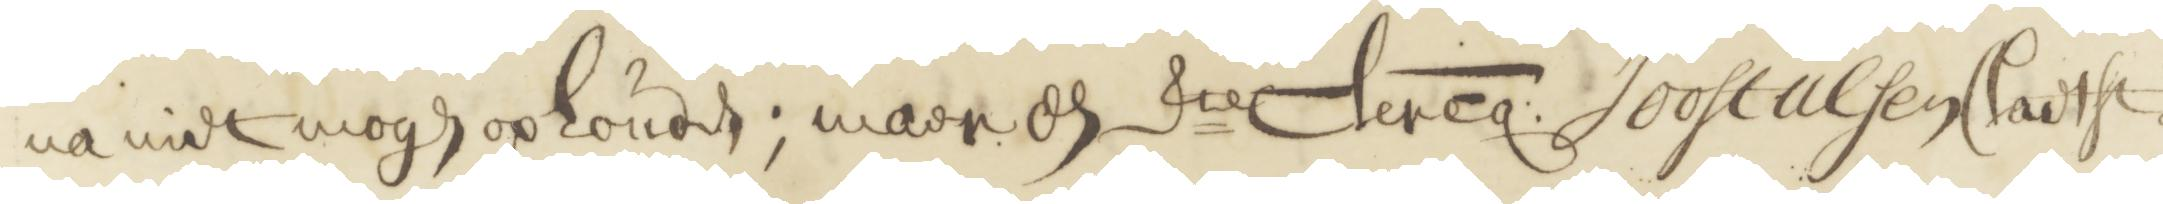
na niet mogen op houden; maer den E=te clercq: Joost ulsen (laetst
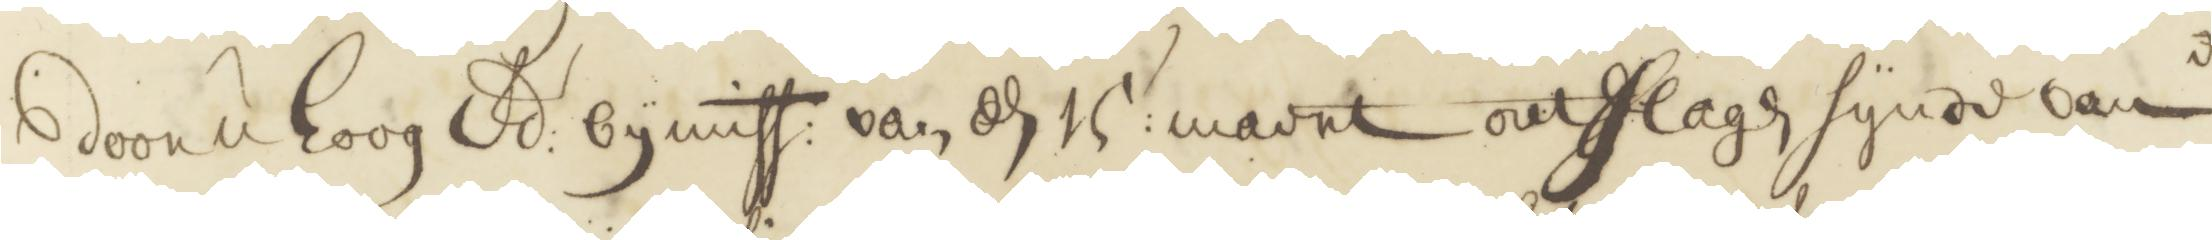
door u hoog Ed:' bij miss: van den 15:' maert ontslagen sijnde van
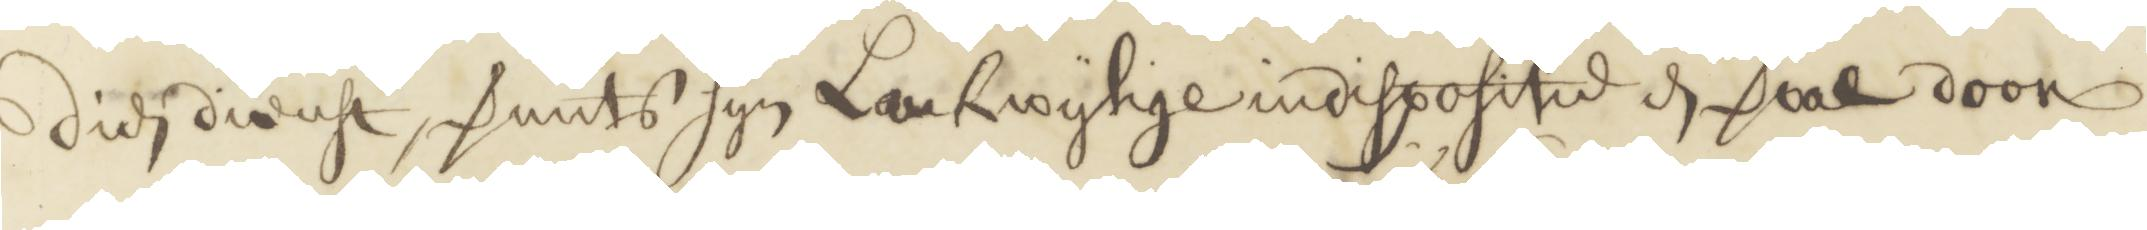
dien dienst, vermits sijn Lankwijkje indispositie en verval door
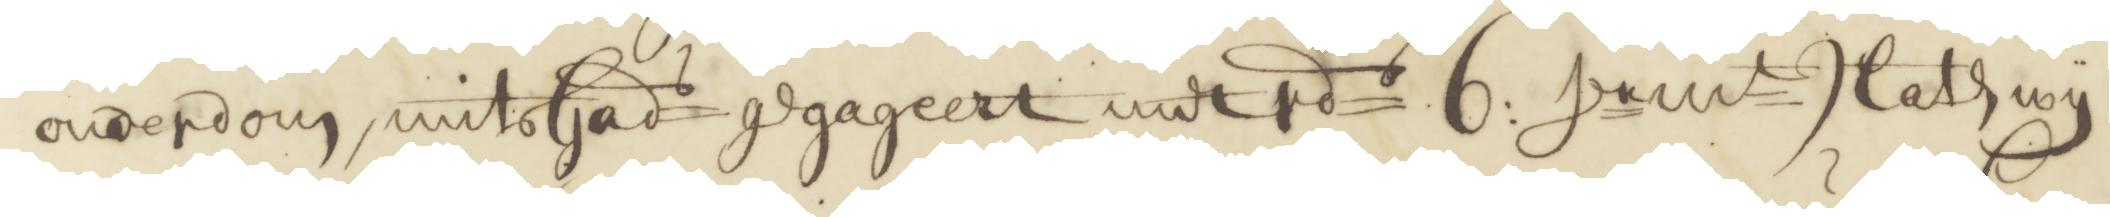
ouderdom, mitsGad=s gegageert met rd=s 6: p=r m=t) laten wij
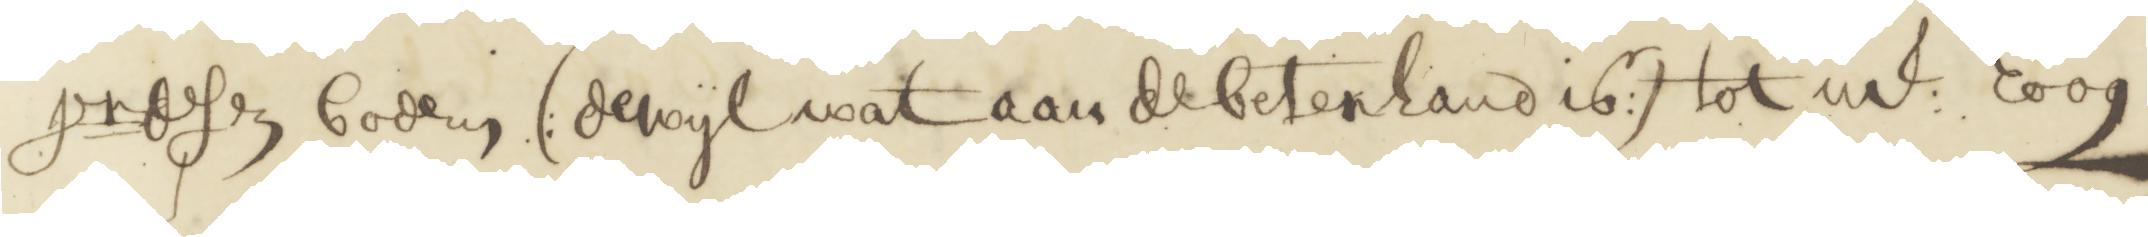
p=r desen bodem (:dewijl wat aan de beterhand is:) tot uE: hoog
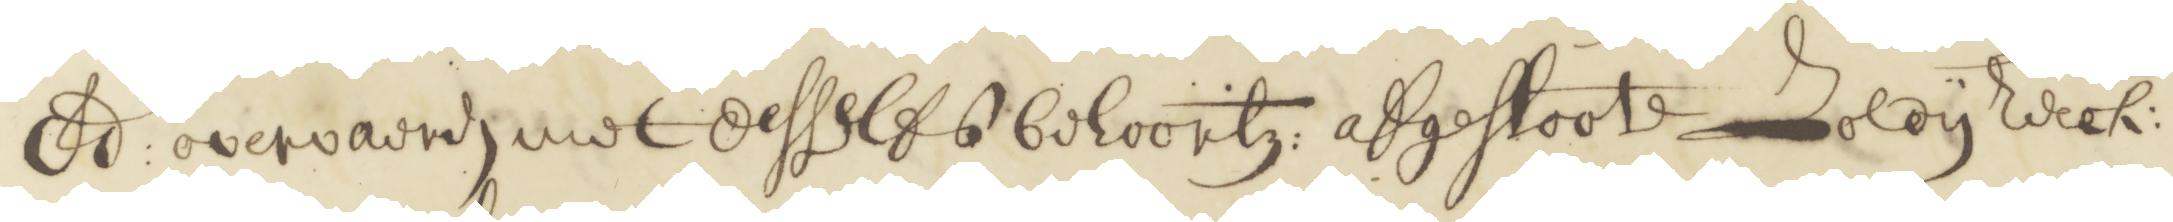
Ed:' overvaeren met desselfs behoorlijk afgesloote zoldij reeck:
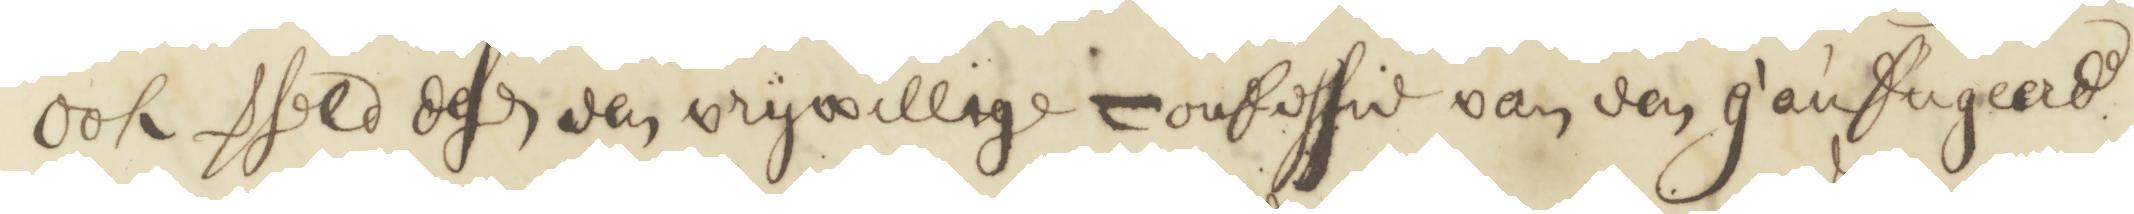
ook verseld desen een vrijwillige confessie van een g’aufugeerde
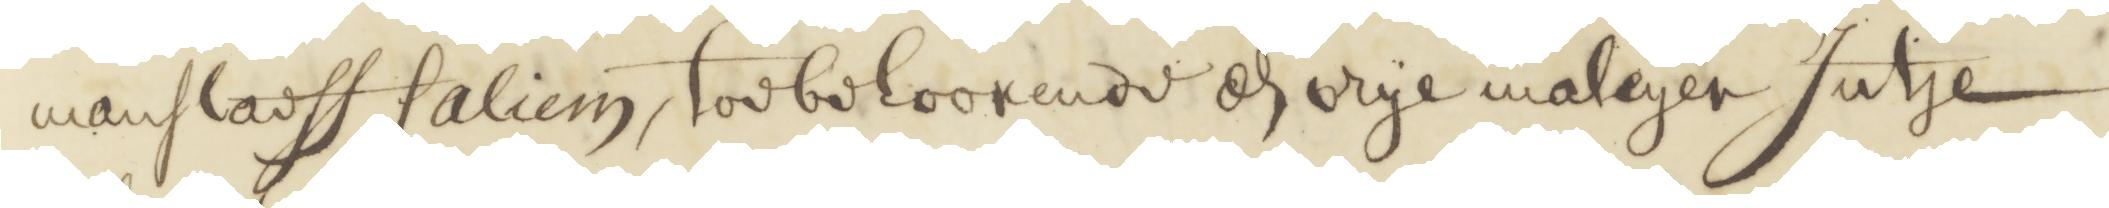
manslaeff saliem, toebehoorende den vrije maleijer Jntje
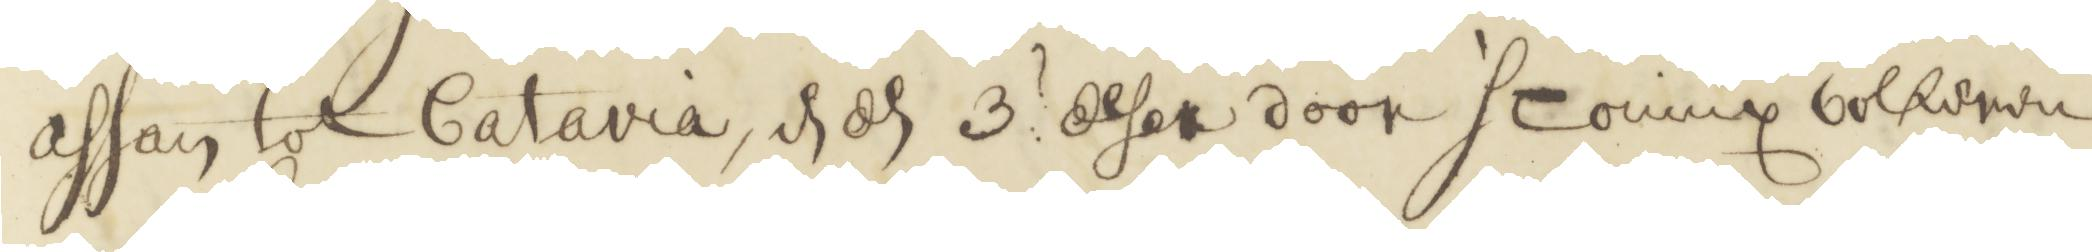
assan tot Batavia, en den 3:' deser door ’s coninx volkeren
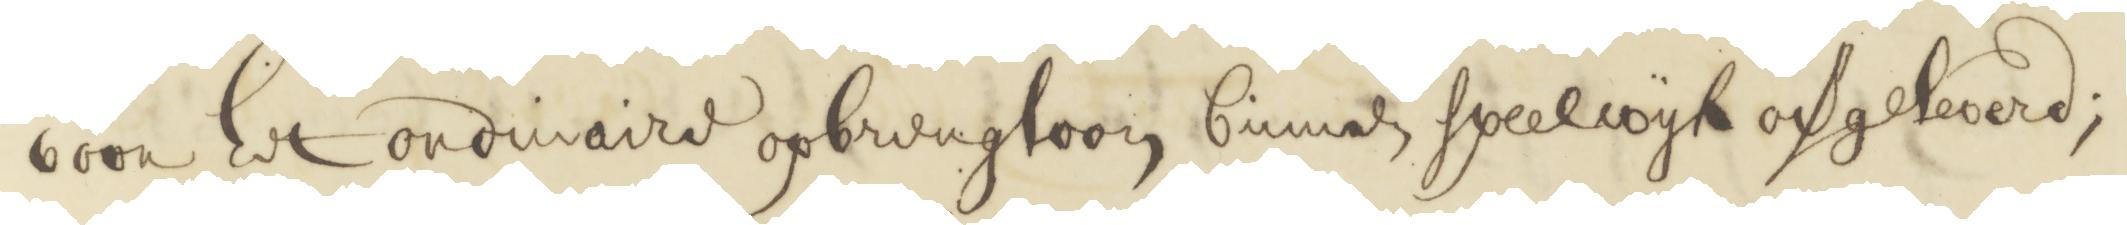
voor het ordinaire opbrengloon binnen speelwijk overgeleverd;
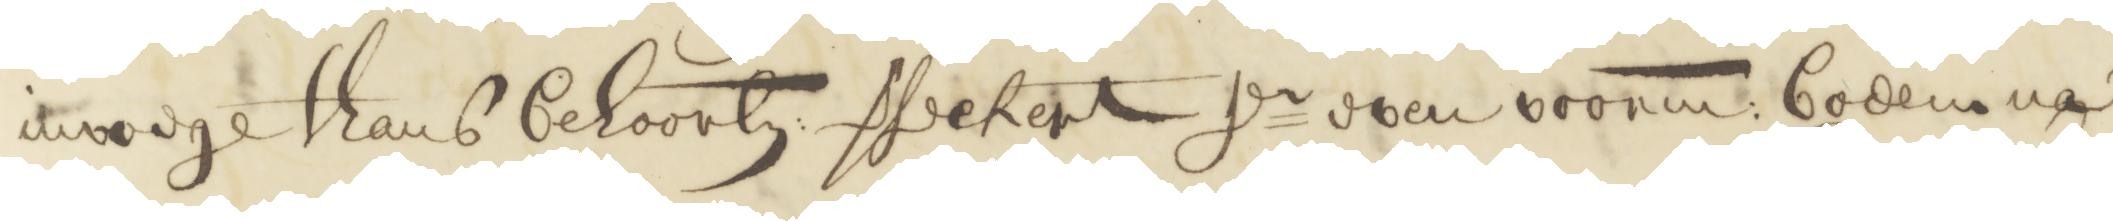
inwege thans behoorlijk verseekert p=r even voorm: bodem na
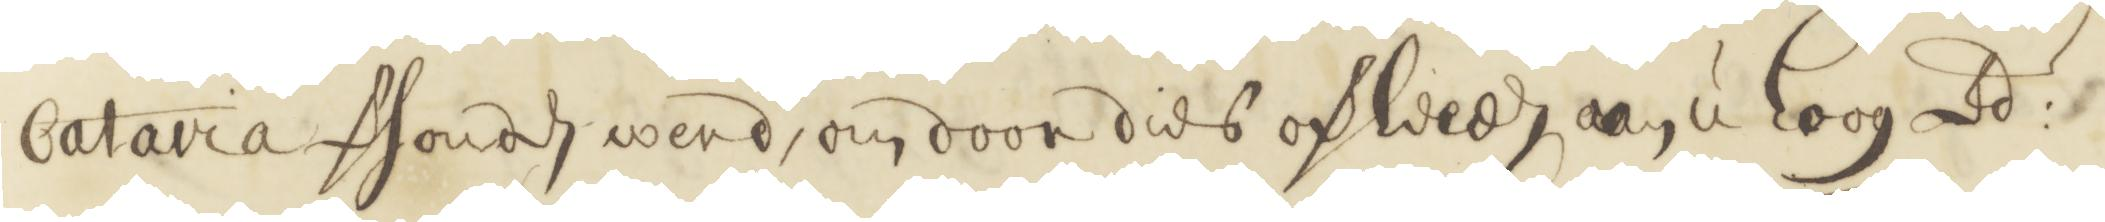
batavia versonden werd, om door dies overleeden aan u hoog Ed:'
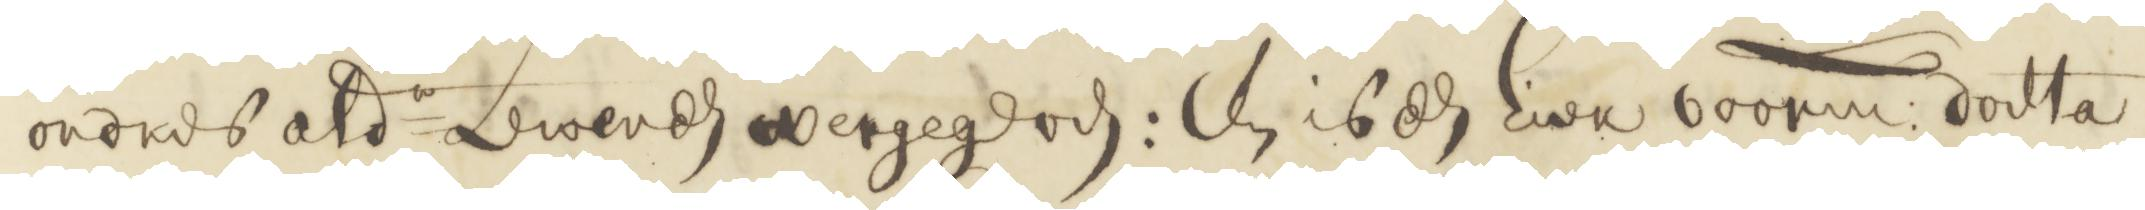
ordres ald=r tewerden overgegeven: En is den hier voorm: doeta
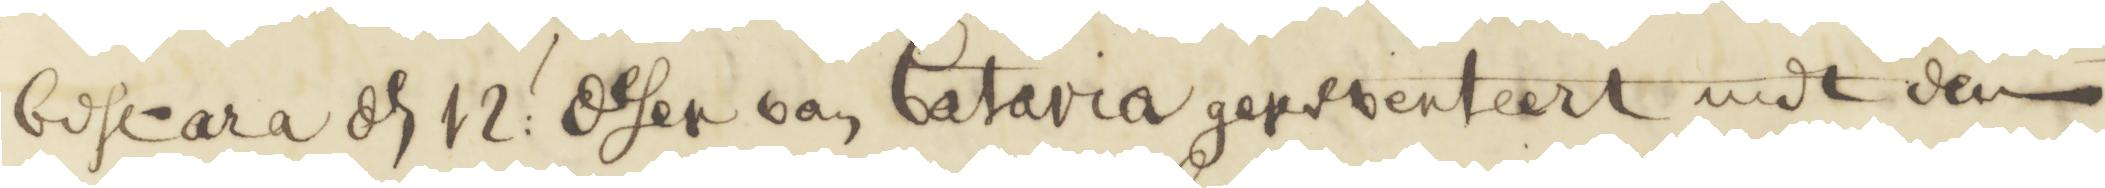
bescara den 12:' deser van Batavia gereverteert met een
